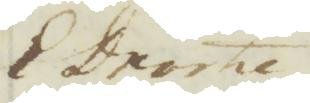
E Droste
